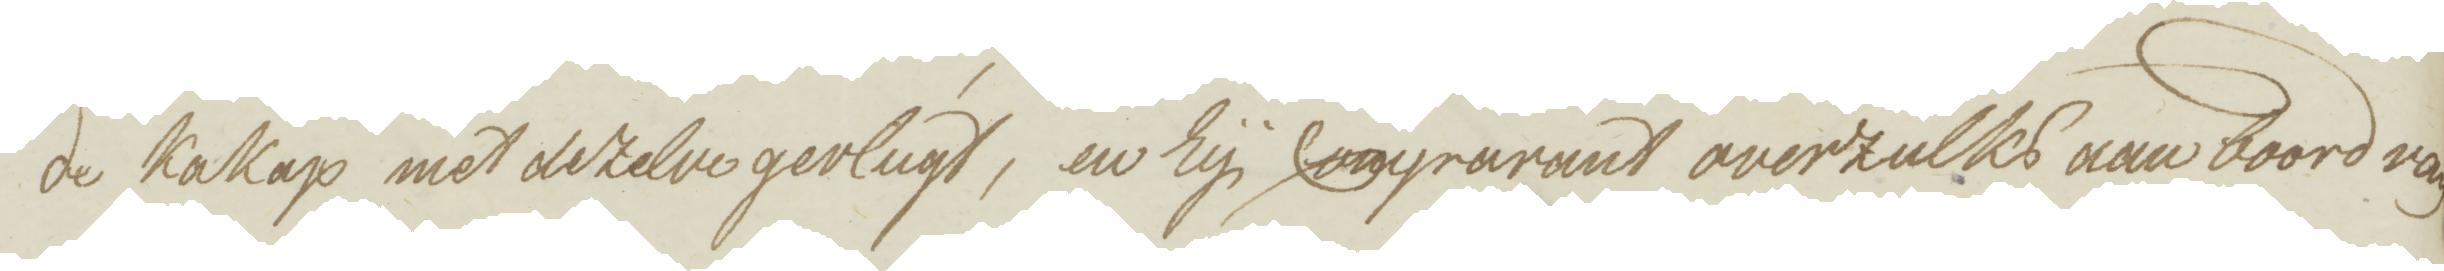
de kakap met dezelve gevlugt, en hij Comparant overzulks aan boord van
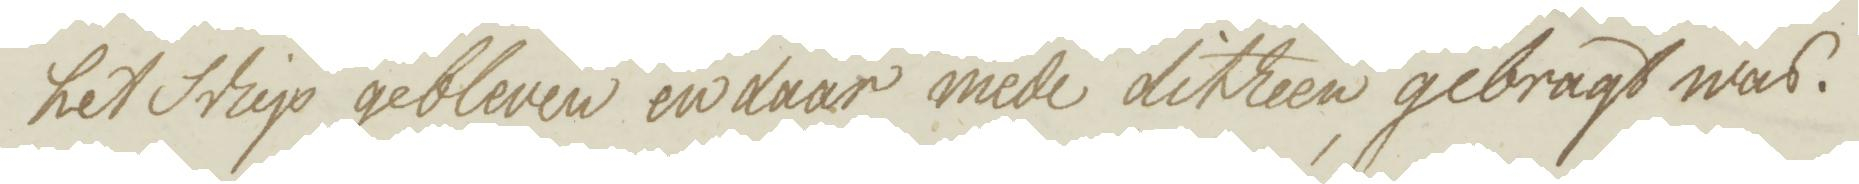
het Schip gebleven en daar mede dit heer gebragt was.
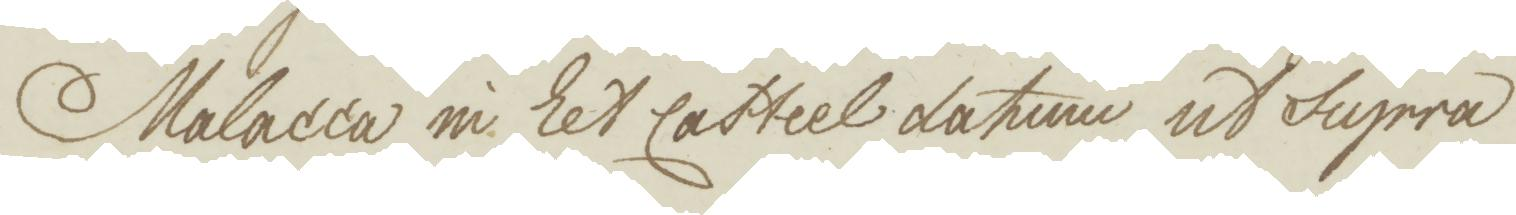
Malacca in het casteel datum ut Supra
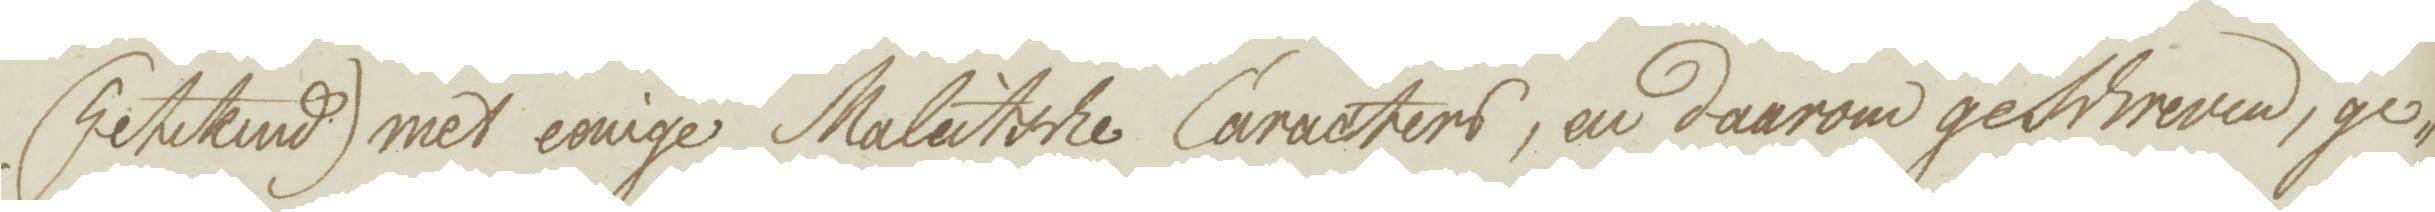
(getekend) met eenige Maleitsche Caracters, en daarom geschreven, ge„
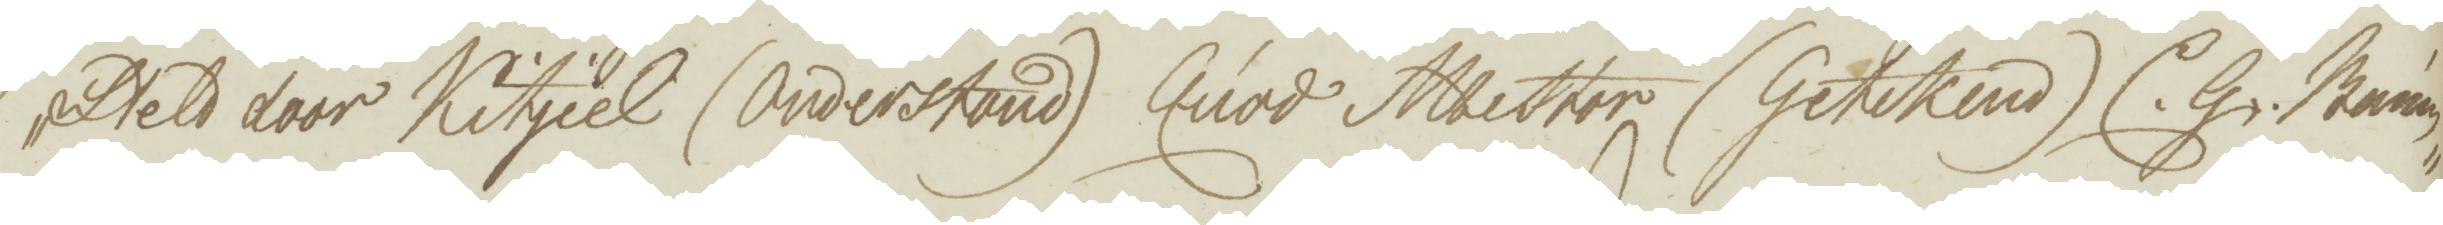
„Steld door Kitjiel (Onderstond) Quod Attestor (Getekend) C. G. Baum„
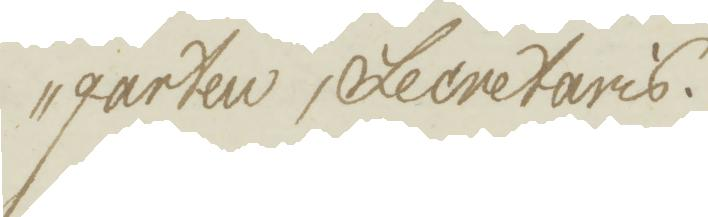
„garten, Secretaris.
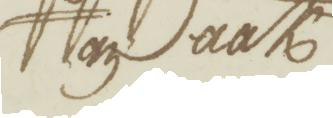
van haak
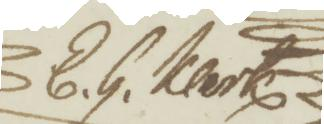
E. G. klerk
